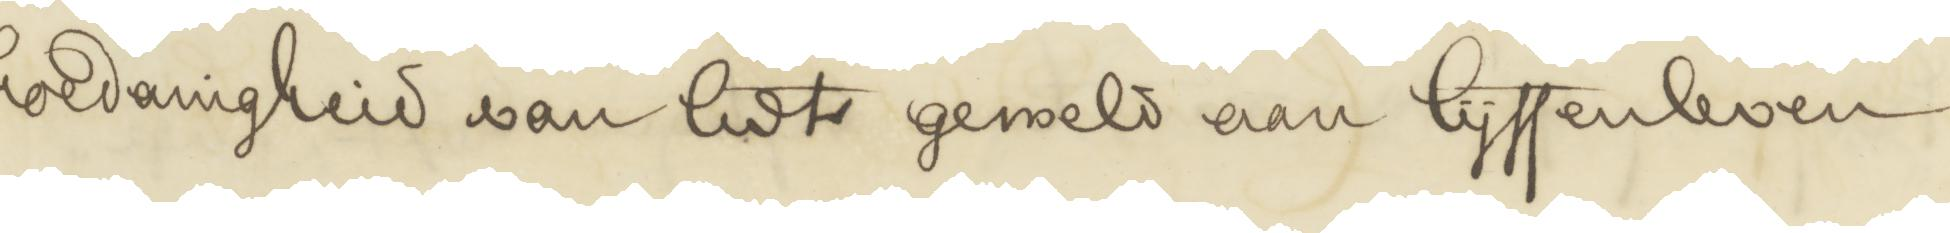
hoedanigheid van het geweld aan lijff en leven
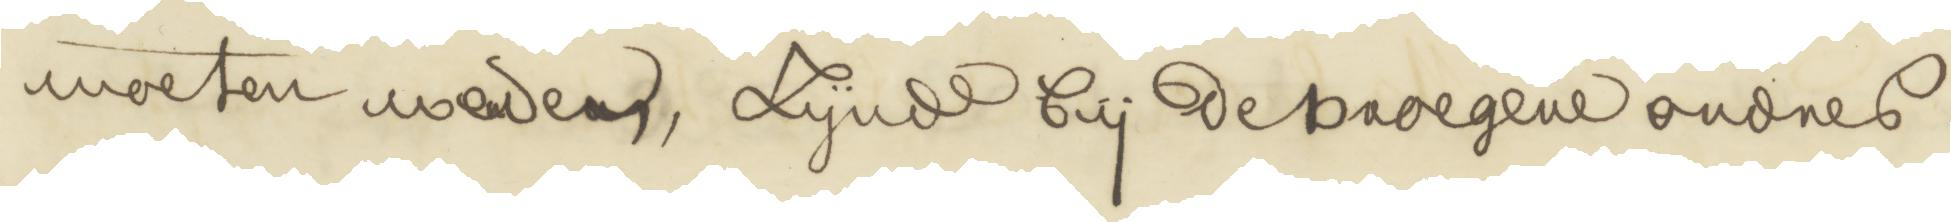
moeten werden, zijnde bij de vroegere ordres
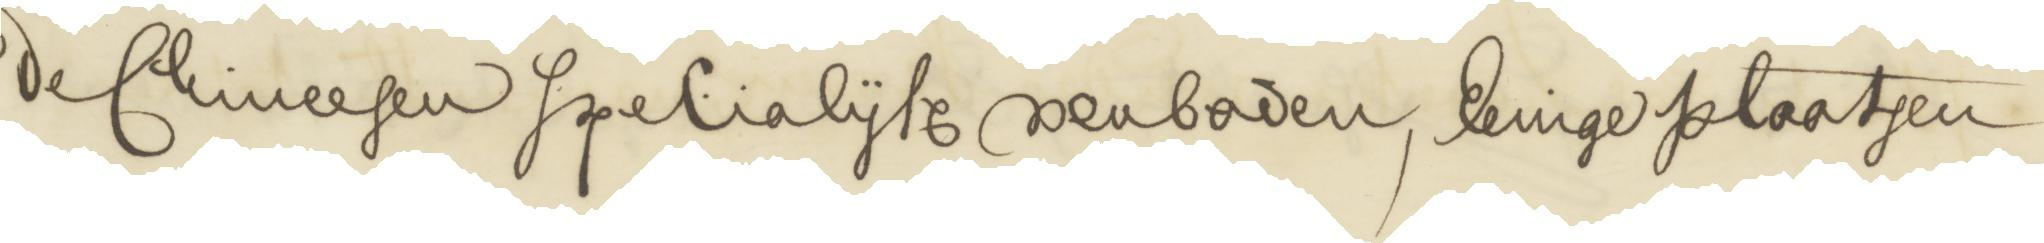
de Chineesen specialijk verboden, eenige plaatsen
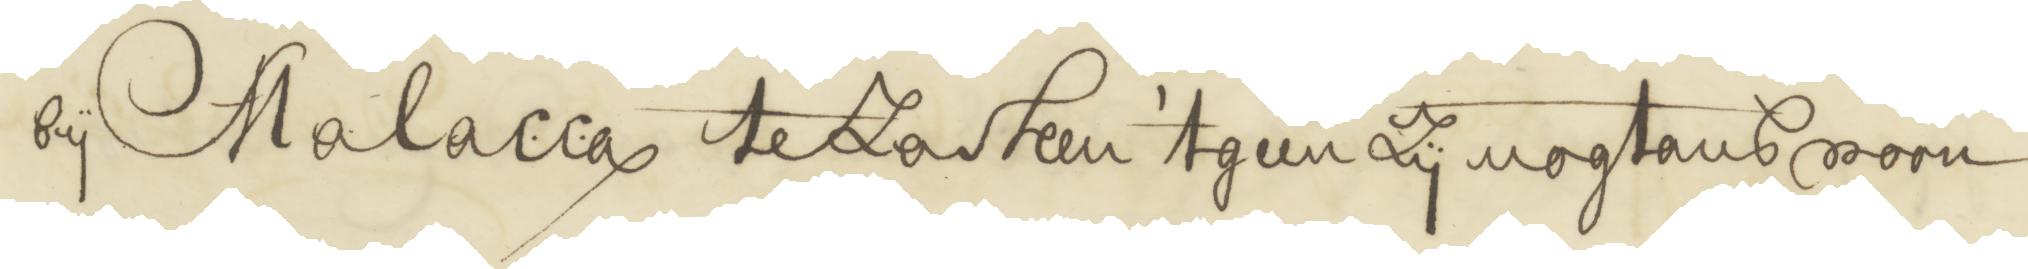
bij Malacca te zoeken ’t geen zij nogtans voor
